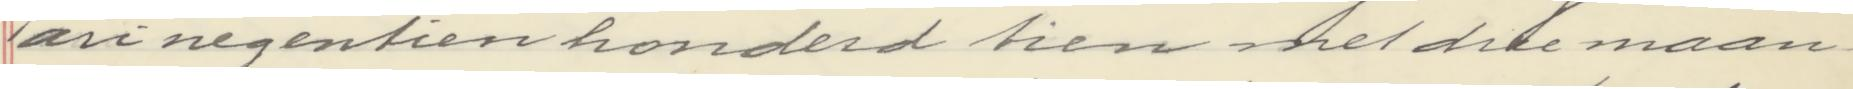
ari negentien honderd tien met die maan
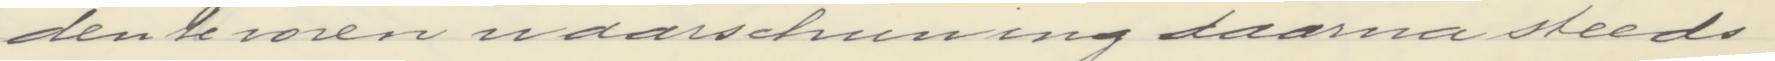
den te voren waarschuwing daarna steeds
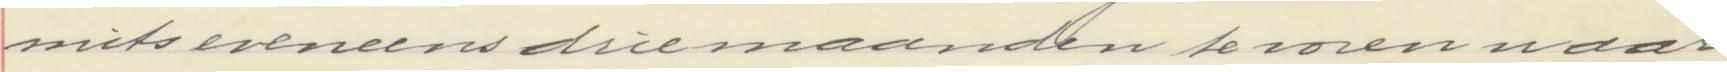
mits eveneens drie maanden te voren waar
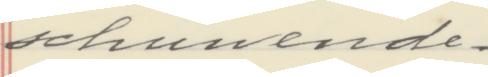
schuwende
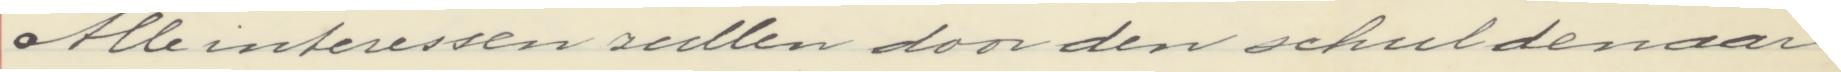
Alle interessen zullen door den schuldenaar
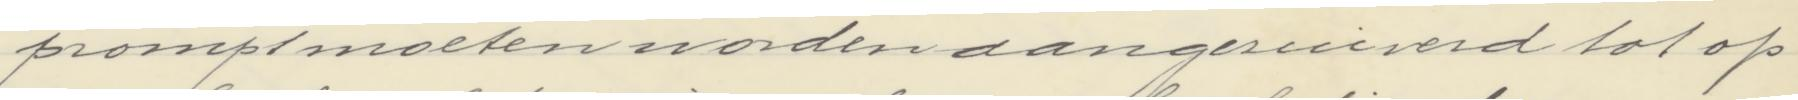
prompt moeten worden aangezuiverd tot op
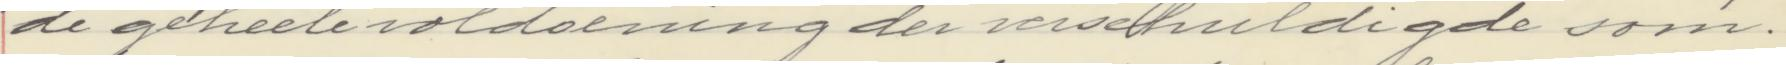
de geheele voldoening der verschuldigde som.
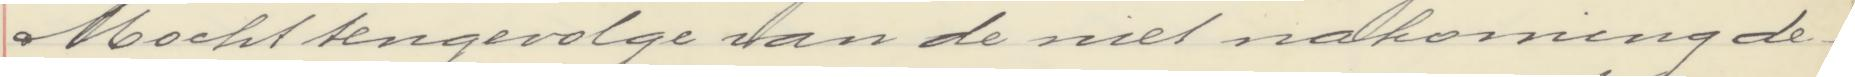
Mocht ten gevolge van de niet nakoming de-
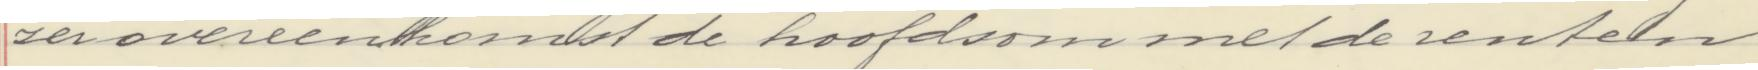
zer overeenkomst de hoofdsom met de renten
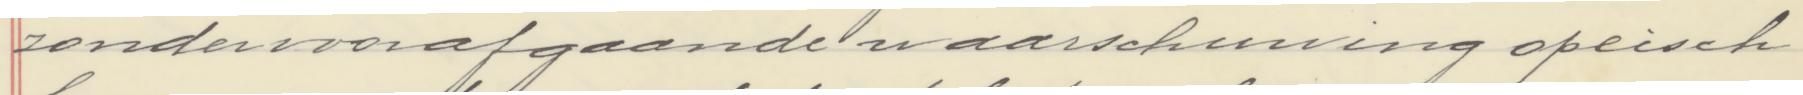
zonder voorafgaande waarschuwing op eisch
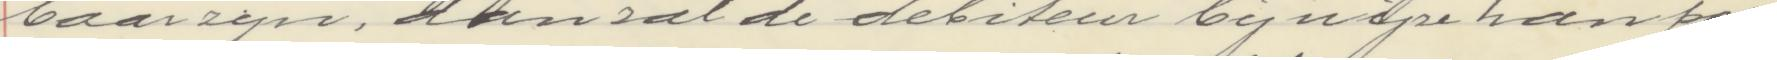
baar zijn, dan zal de debiteur bij wijze van poe
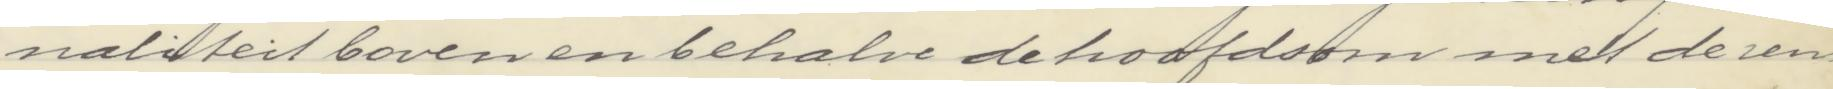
naliteit boven en behalve de hoofdsom met de ven
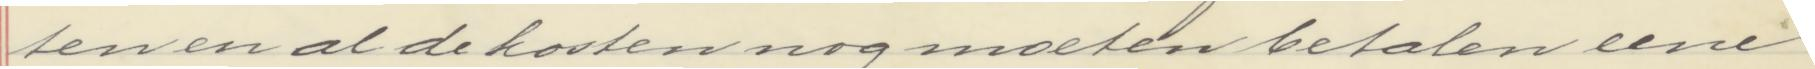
ten en al de kosten nog moeten betalen eene
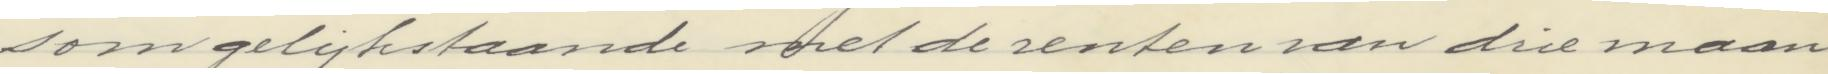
som gelijkstaande met de renten van drie maan
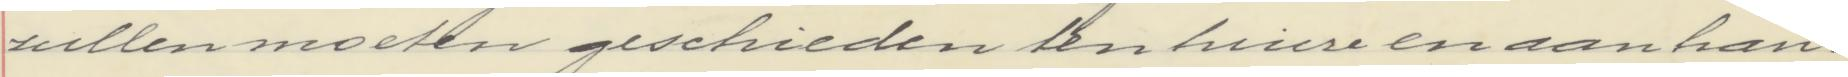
zullen moeten geschieden ten huize en aan han-
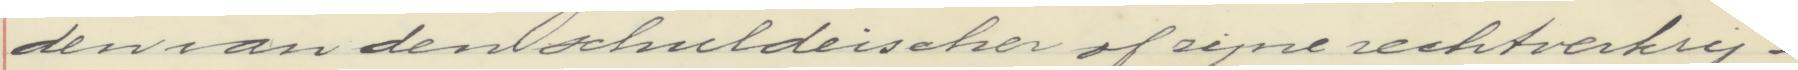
den van den schuldeischer of zijne rechtverkrij-
